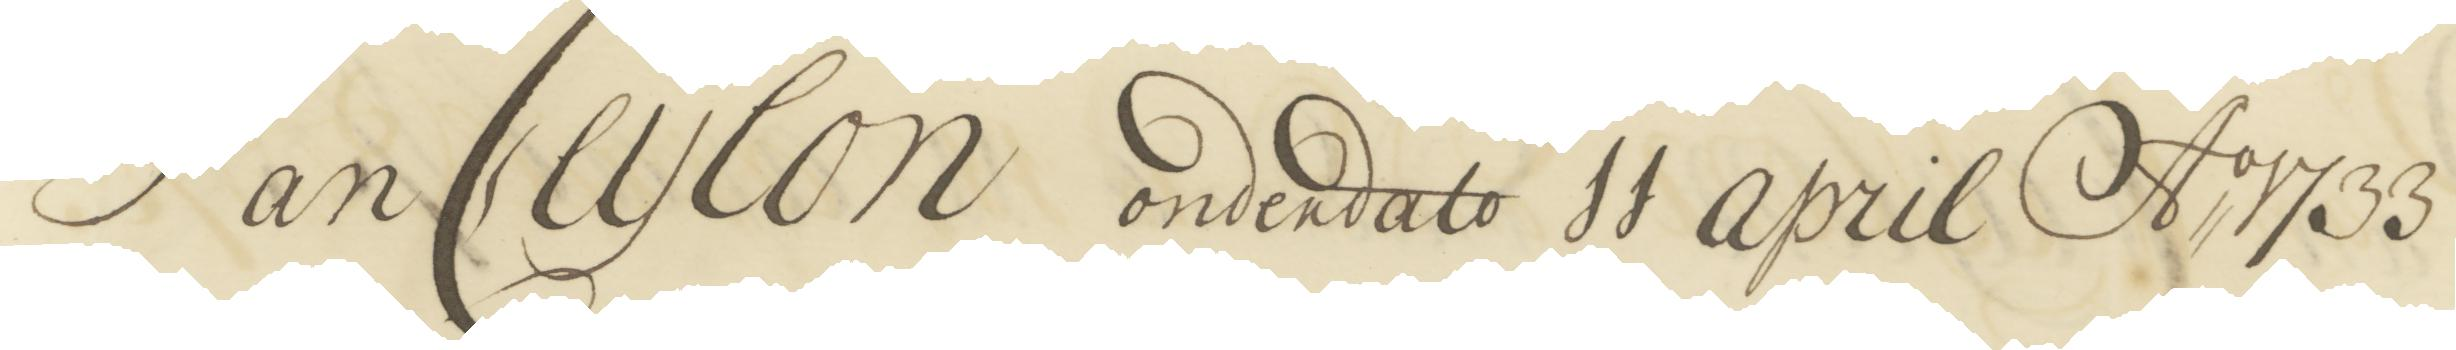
Van Ceijlon onderdato 11 april A„o 1733
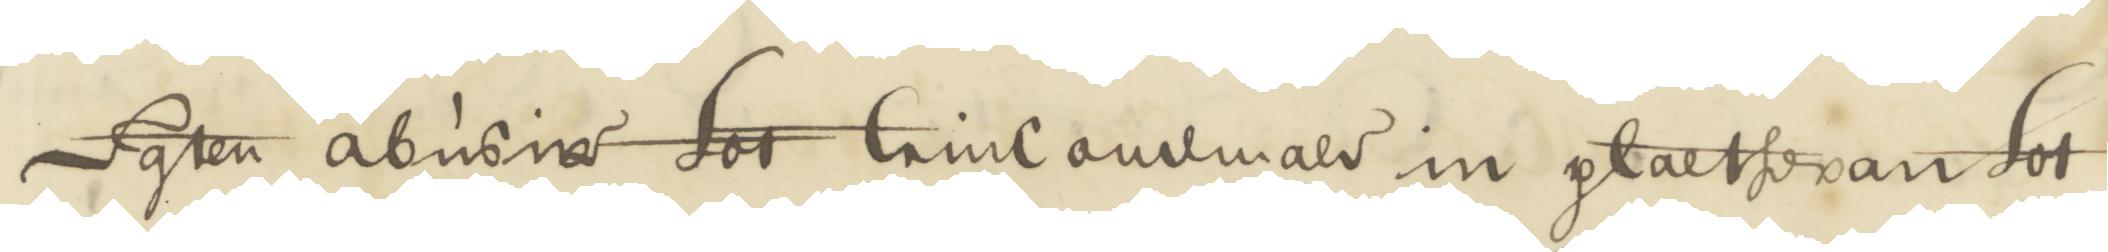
Egter abusive tot trinconemale in plaetse van tot
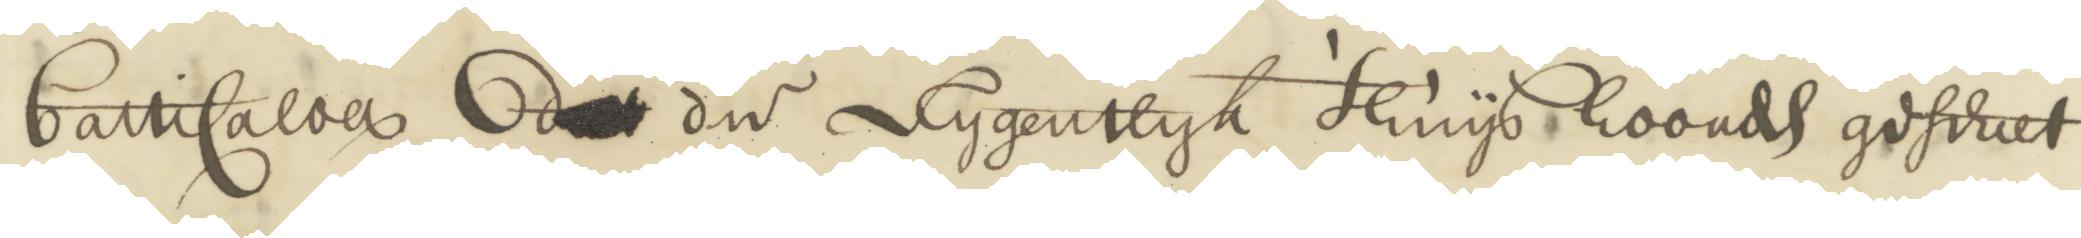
batticaloa dat die Eygentlyk 'thuijs hoorden geschiet
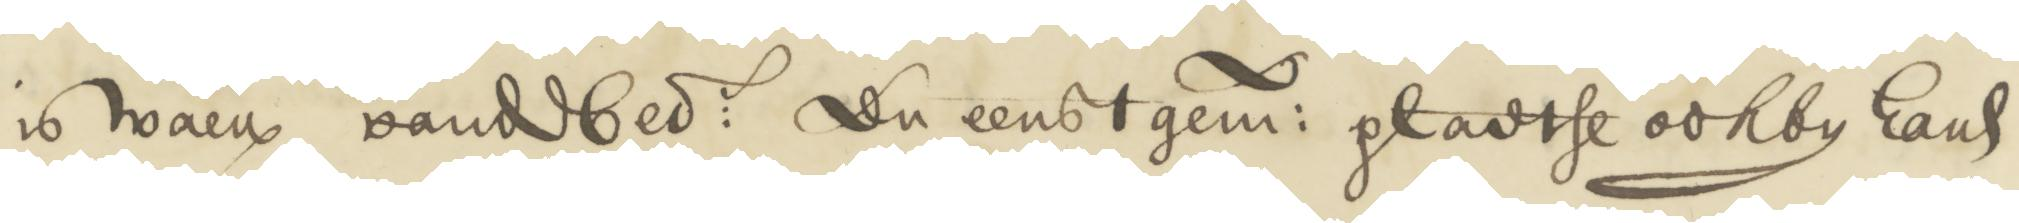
is waer van de bed:s ten eerst gem:s plaetse ook by haren
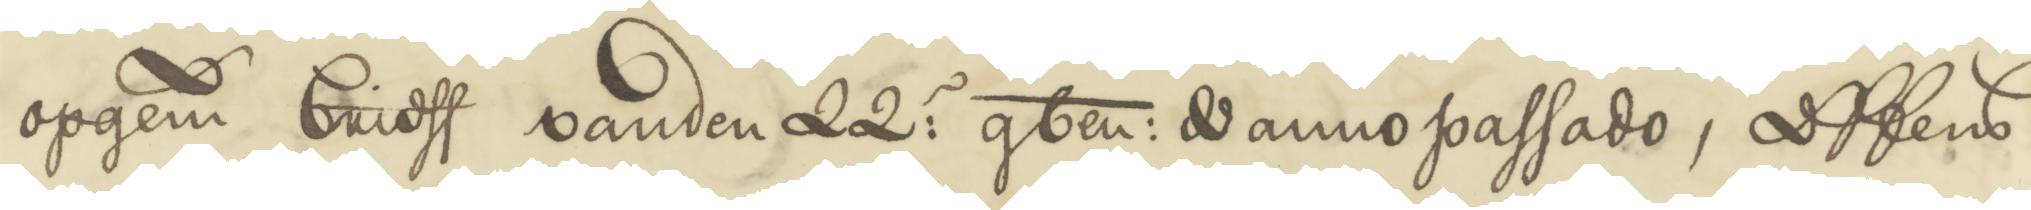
opgem brieff van den 22:e 9ber: de anno passado, teffens
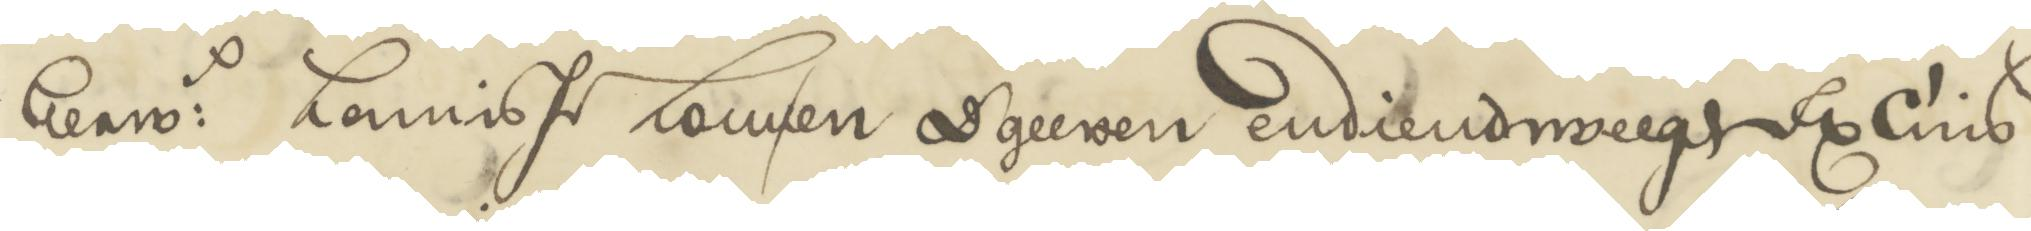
herw:s kennisse komnen te geeven en diendweegen Excuis
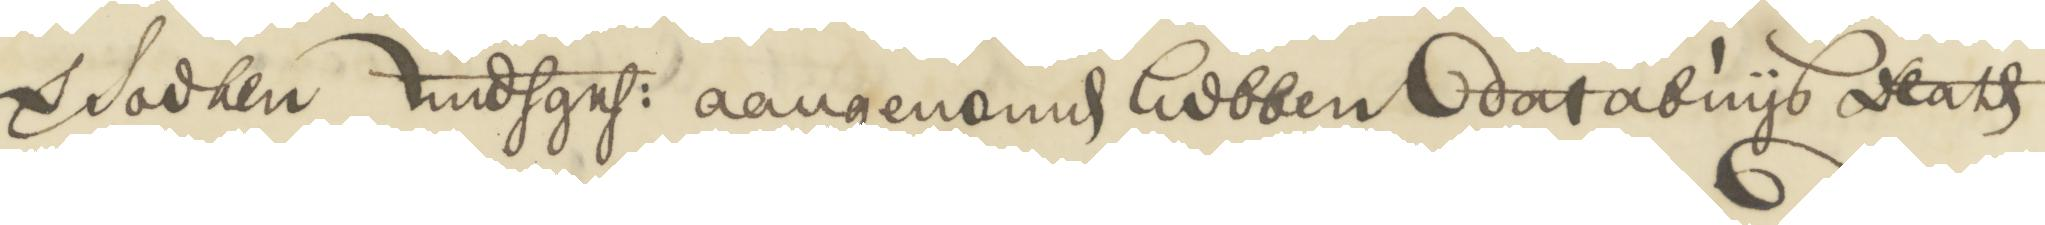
versoeken midsgrs: aangenomen hebben dat abuijs telaten
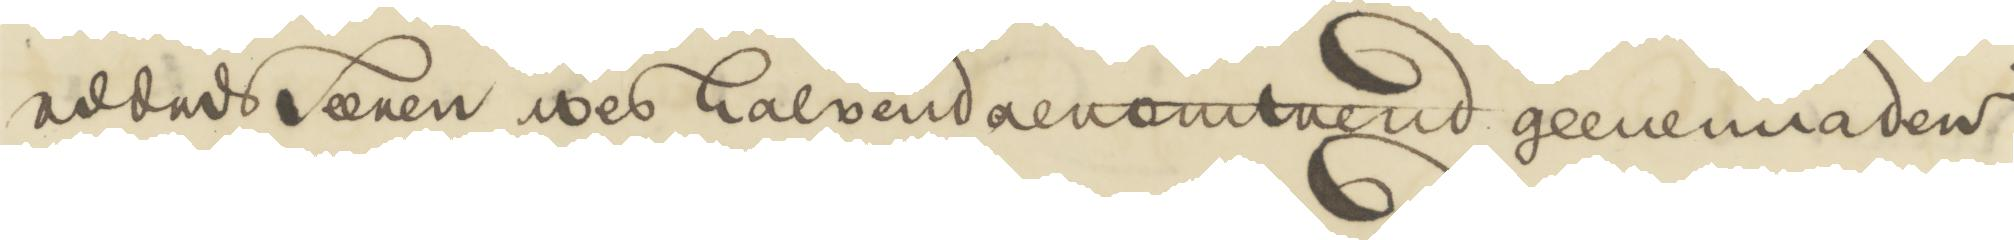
redresseeren weshalven daer omtrend geenen nadere,
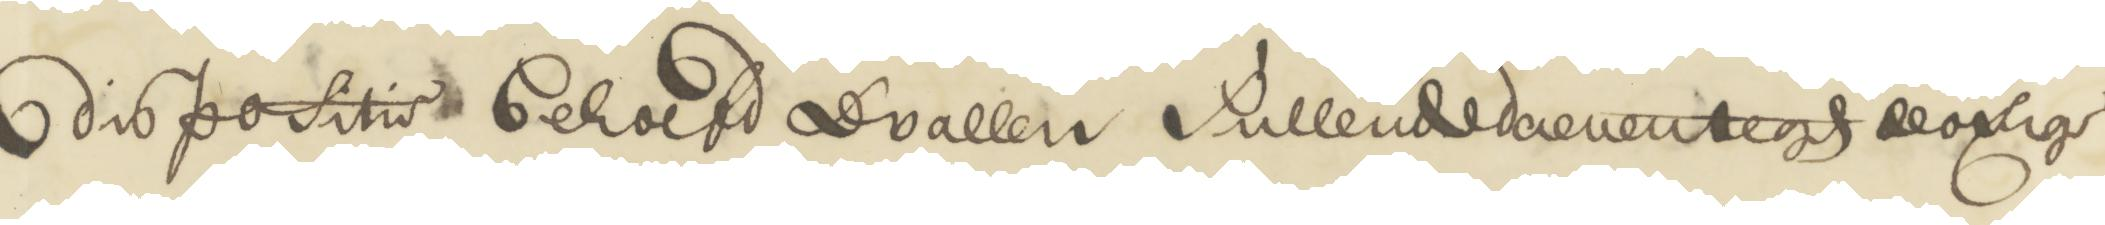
dispositie behoefd te vallen Sullende daerentegen de overige
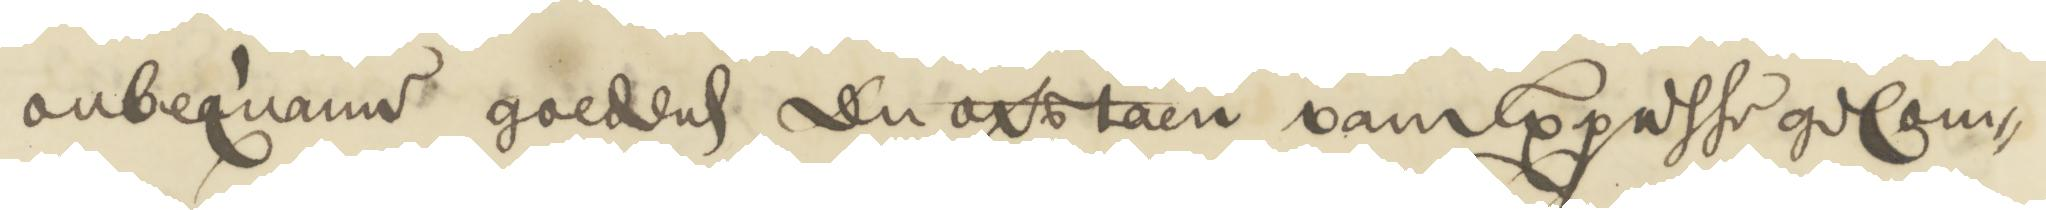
onbequame goederen ten overstaen van Expresse gecom„
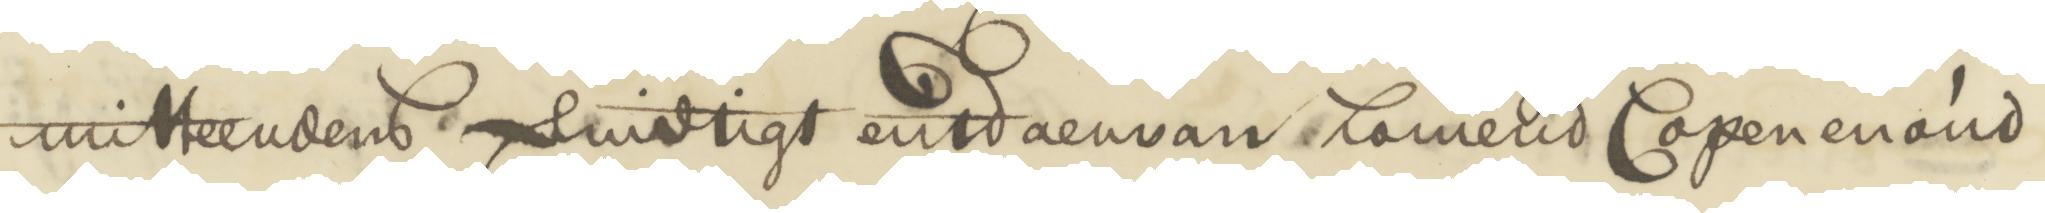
mitteerdens vernietigt ent daervan komend Coper en oud
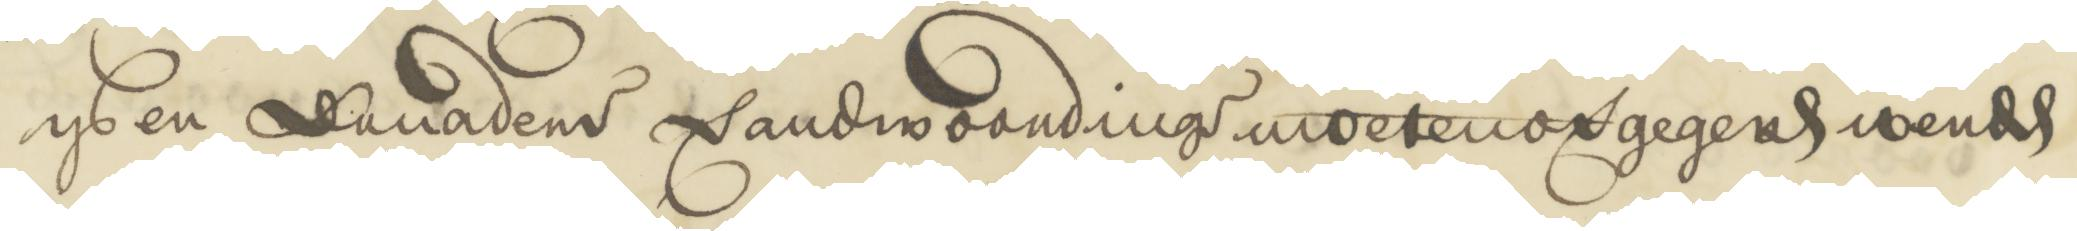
yser ternadere verandwoordinge moeten overgegeven werden
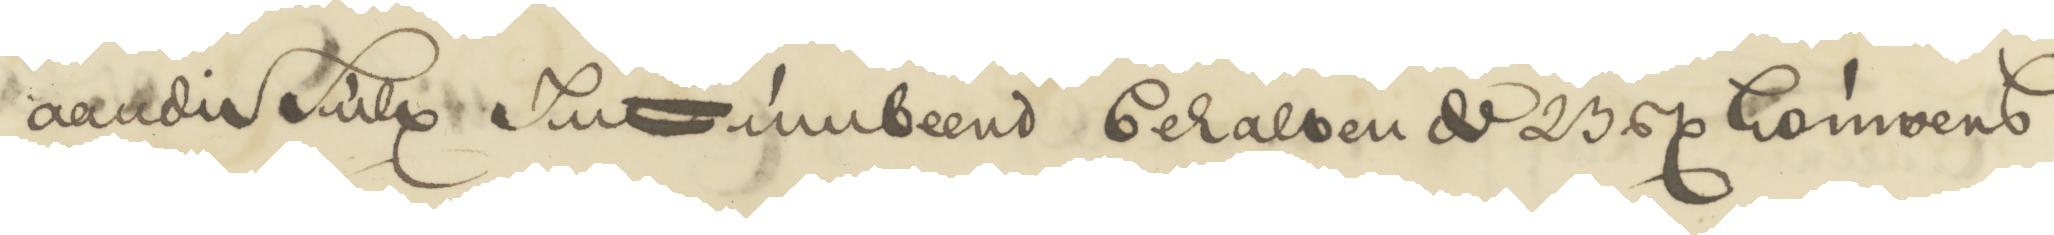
aan die Sulx Sucumbeerd behalven de 23 sx houwers
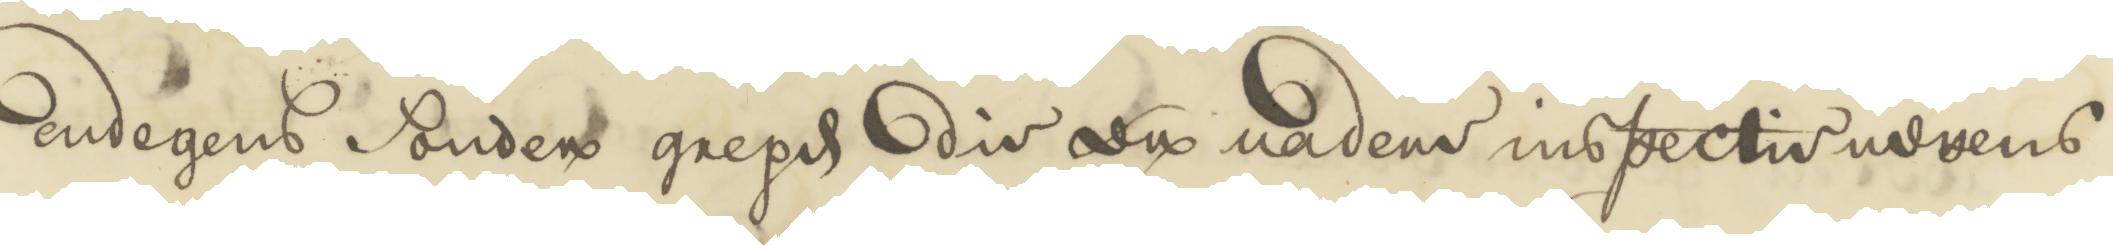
en degens Sonder grepen die ter nadere inspectie nevens
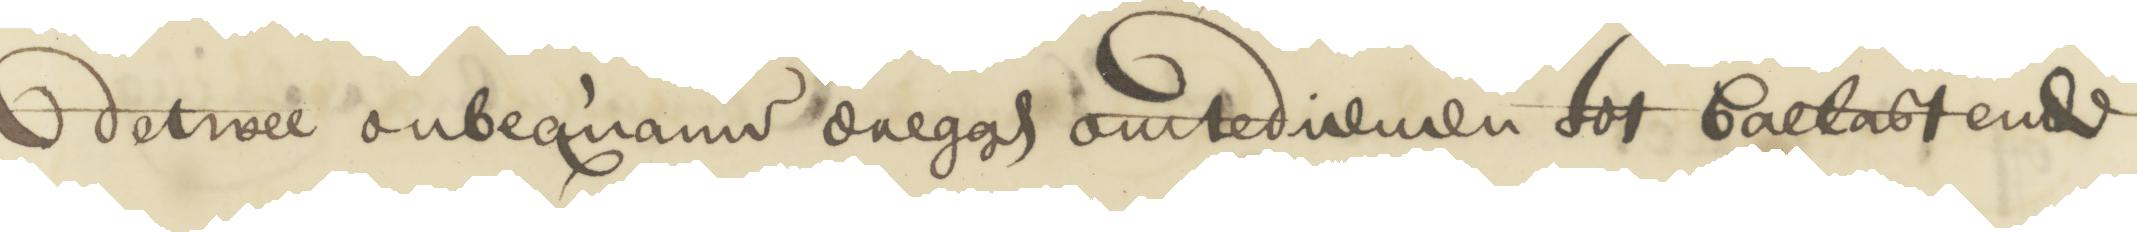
de twee onbequame dreggen om te dienen tot ballast ende
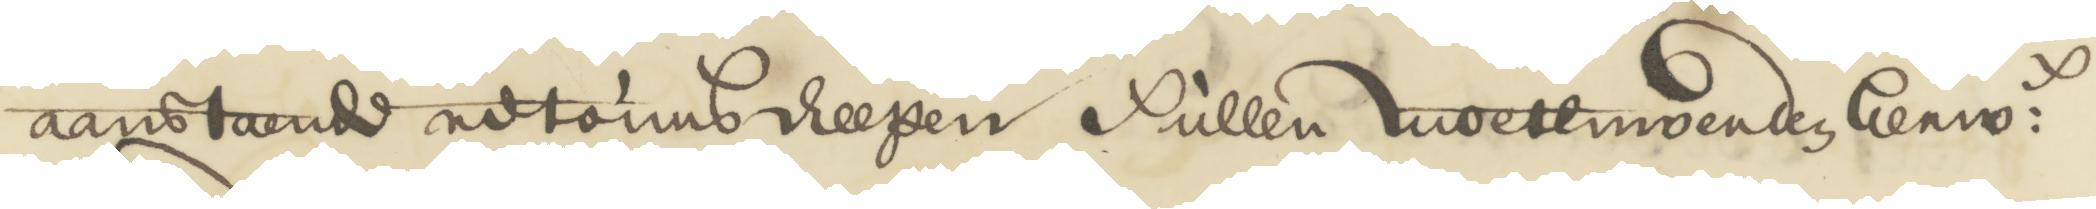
aanstaende retourscheepen Sullen moeten werden herw:s
